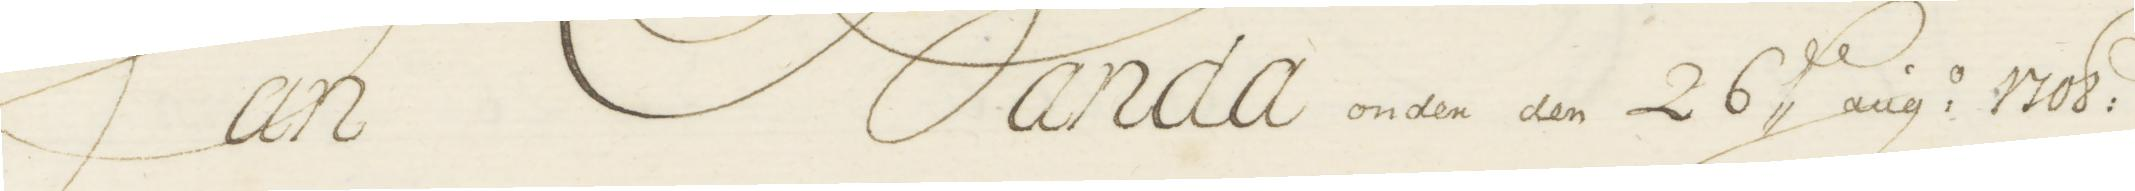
Van Banda onder den 26„e aug:o 1708:
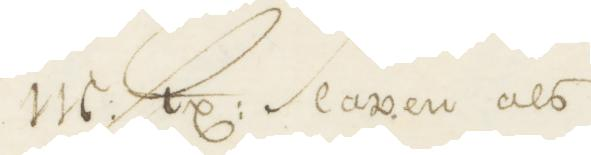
115: stx: slaven als
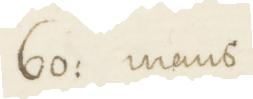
60: mans
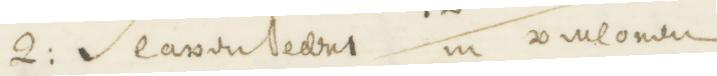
2: Slaven sedert 12/m verloren
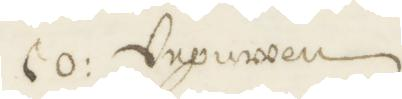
50: Vrouwen
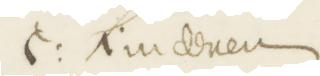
5: kinderen
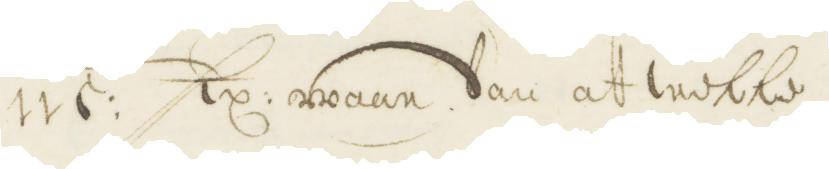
115: stx: waar van aftrekke
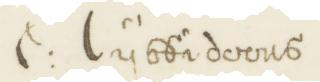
5: tijssidoors
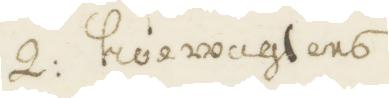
2: koewagters
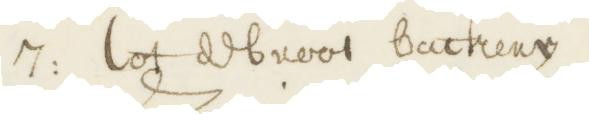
7: tot de broot backery
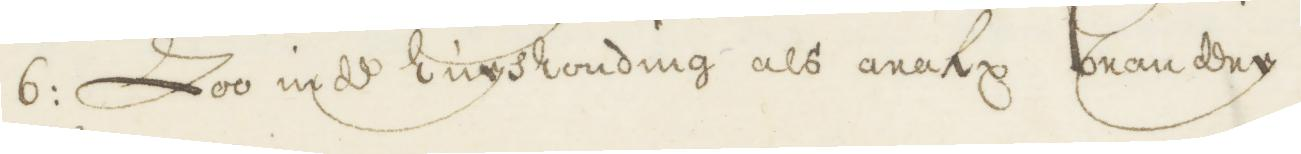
6: zoo in de huyshouding als arakx brandery
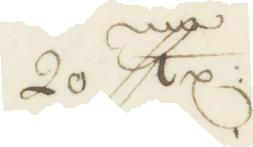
20 stx:
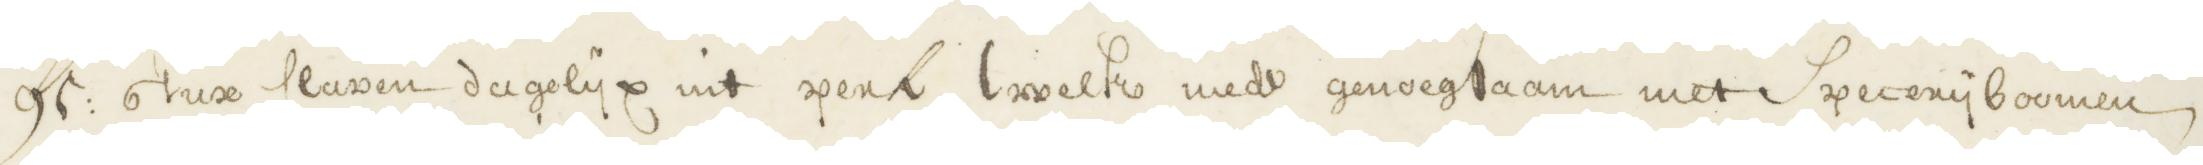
95: stux slaven dagelijx int perk t welk mede genoegsaam met specerijboomen
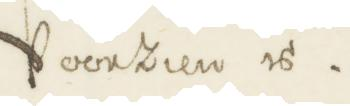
voorzien is.
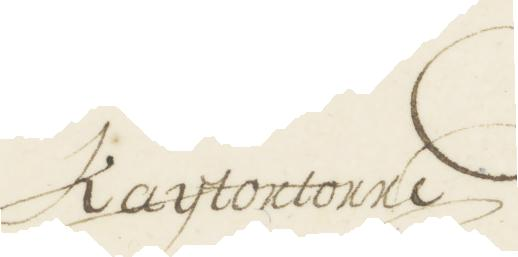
Kaytortorre
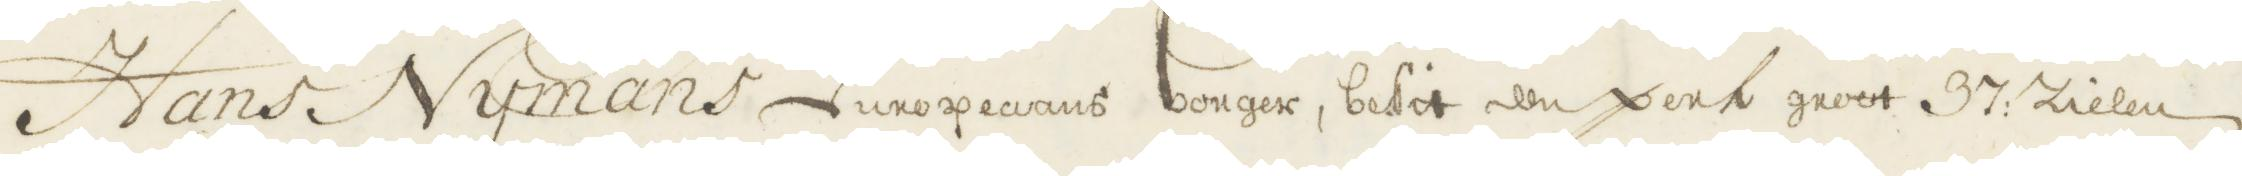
Hans Nymans Europeaans borger, besit een perk groot 37: zielen
